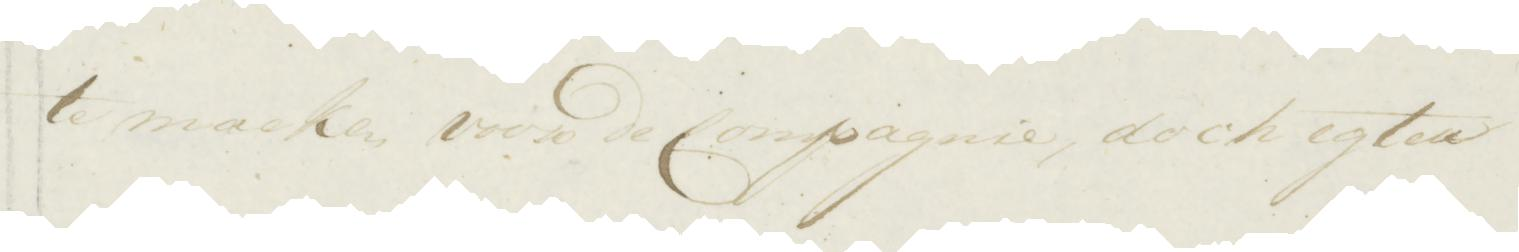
te maeken voor de Compagnie, doch egter
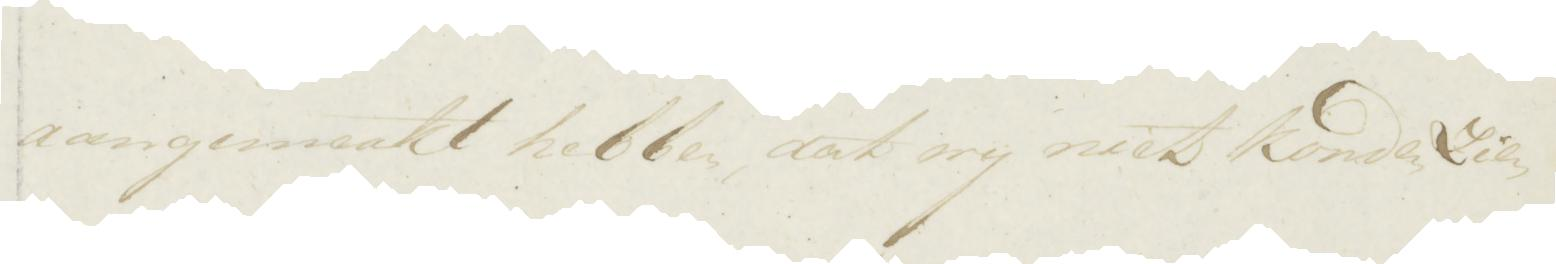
aangemerkt hebben, dat wij niet konden zien
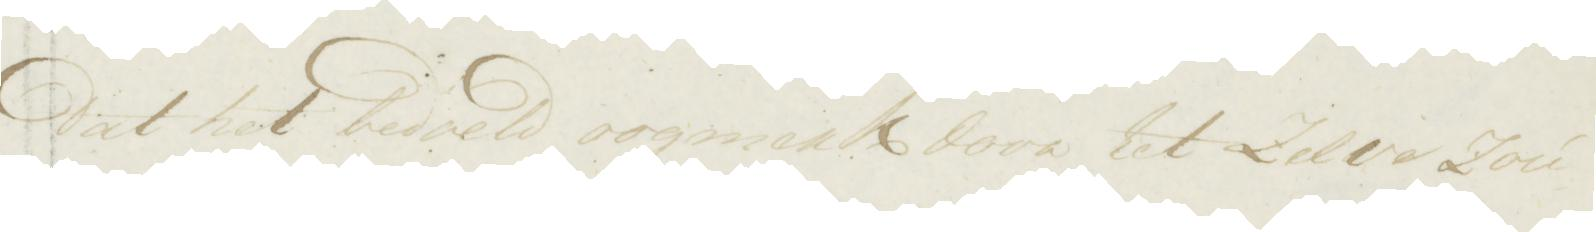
dat het bedoeld oogmerk door het zelve zou
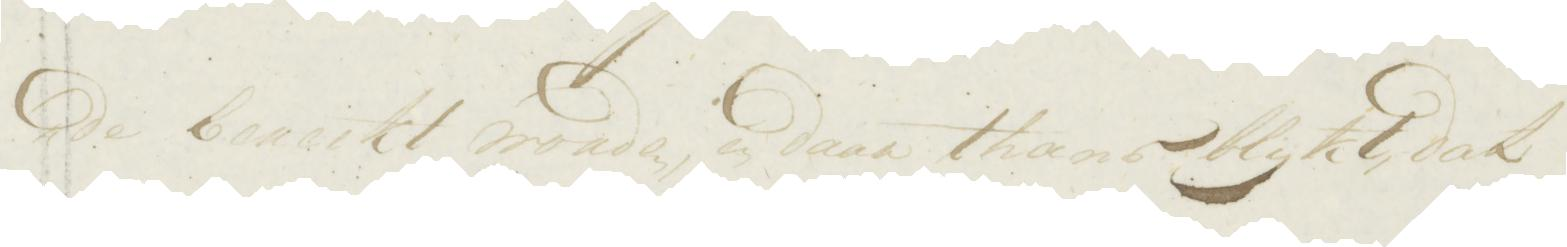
de bereikt worden, en daar thans blijkt, dat
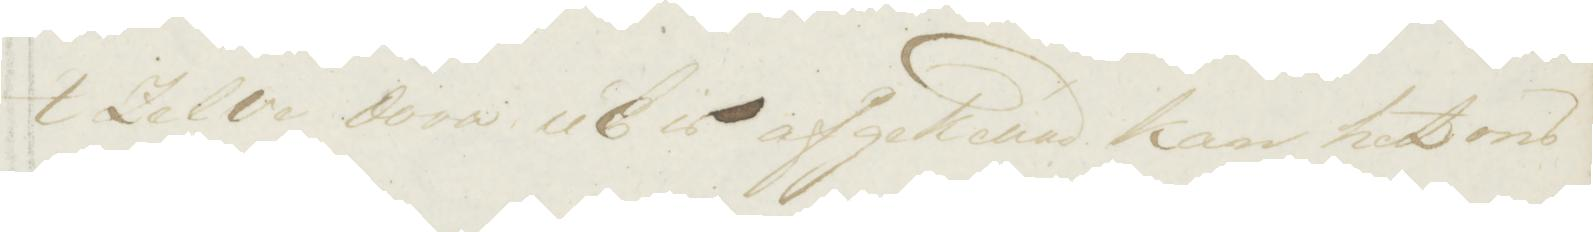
’t zelve door uE is afgekeurd kan het ons
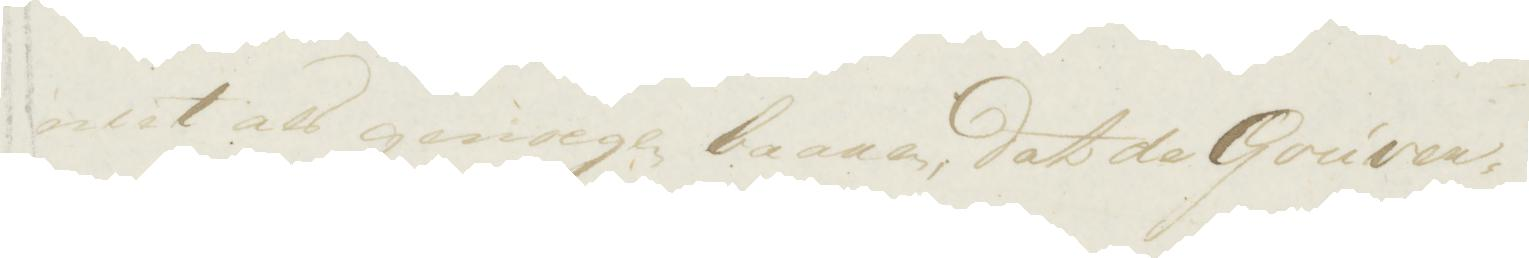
niet als genoegen baaren, dat de Gouver„
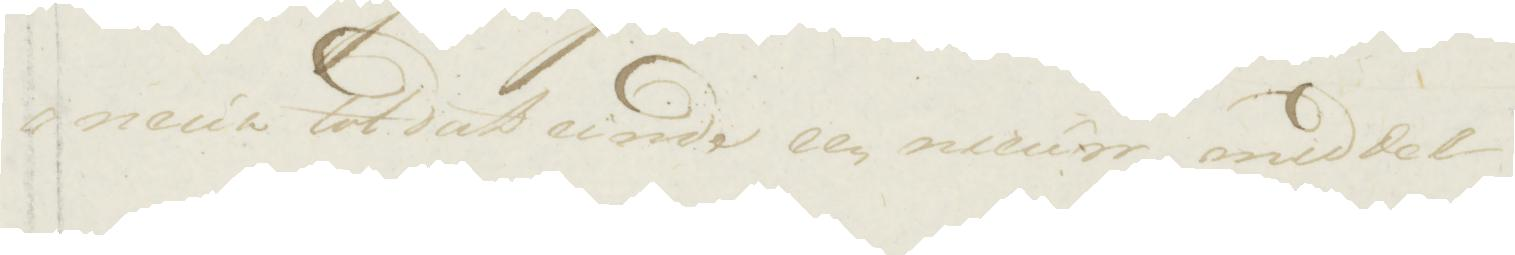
neur tot dat einde een nieuw middel
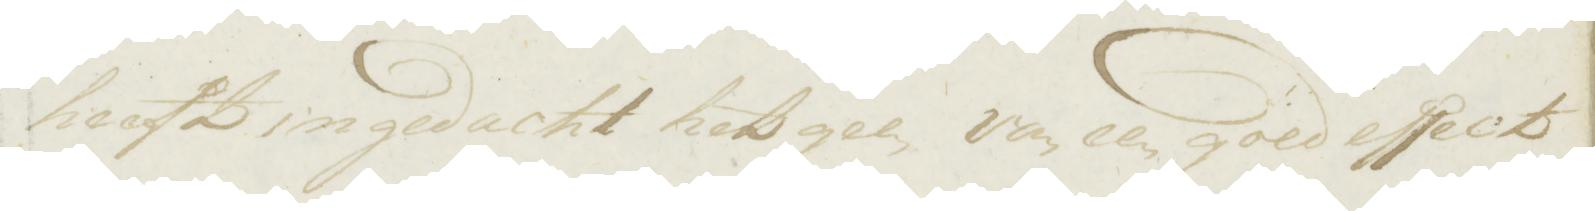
heeft in gedacht het geen van een goed effect
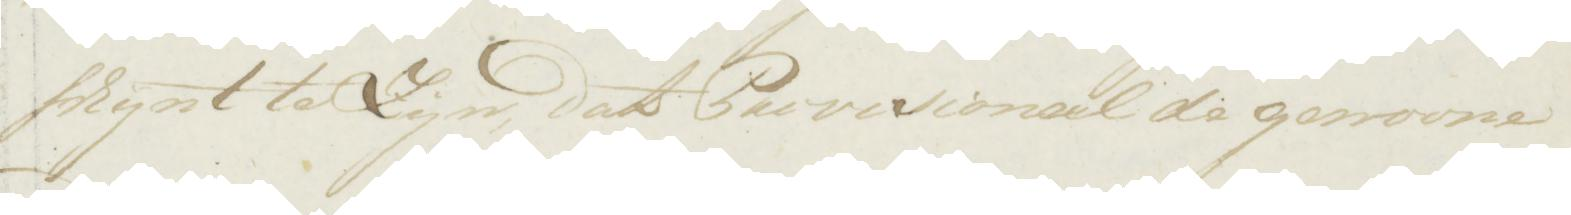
schijnt te zijn, dat Provisioneel de gewoone
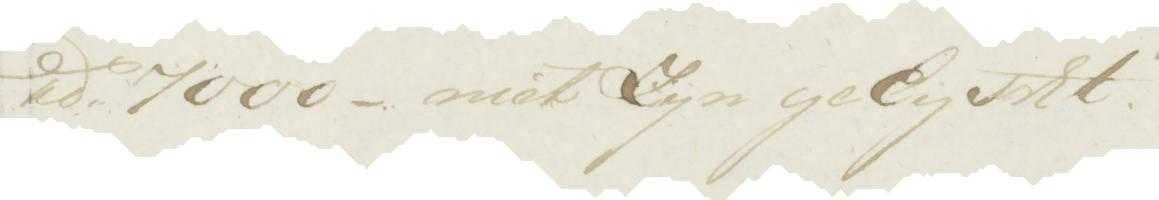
rd„ 7000 -. niet zijn geEijscht.
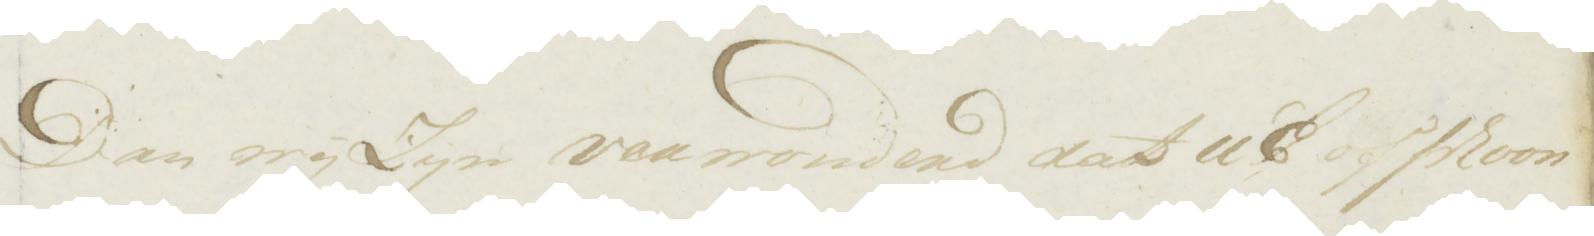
Dan wij zijn verwonderd dat UE ofschoon
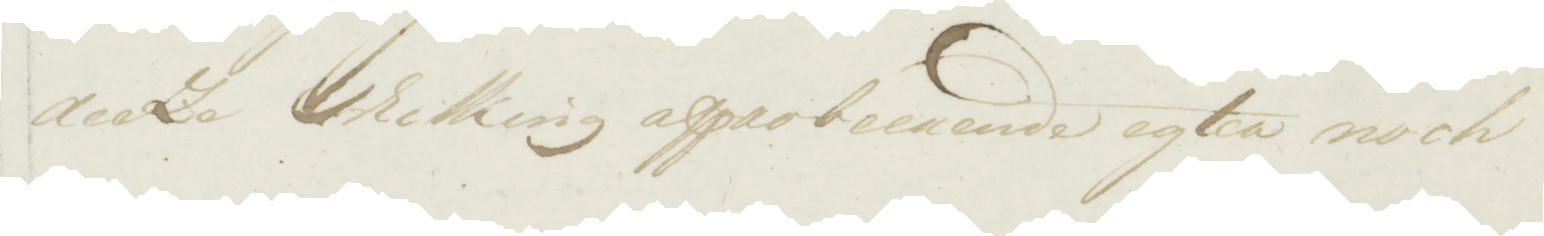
deeze schikking approbeerende egter noch
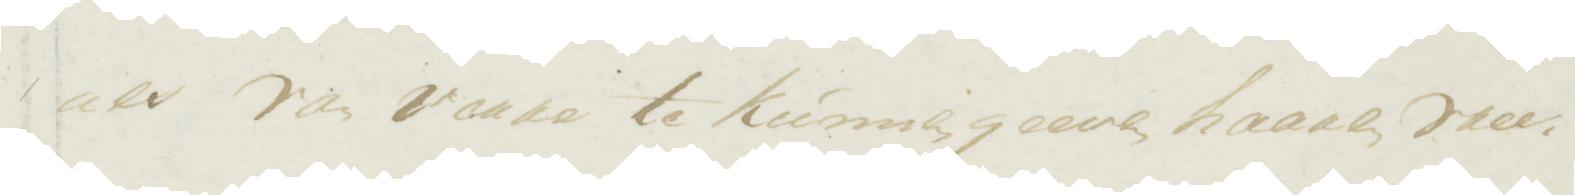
als van verre te kunnen geeven haaren vree„
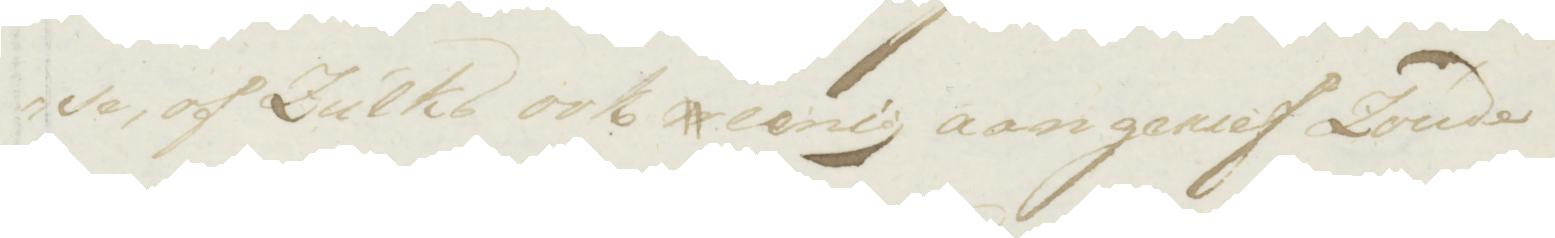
„se, of zulks ook weenig aangerief zoude
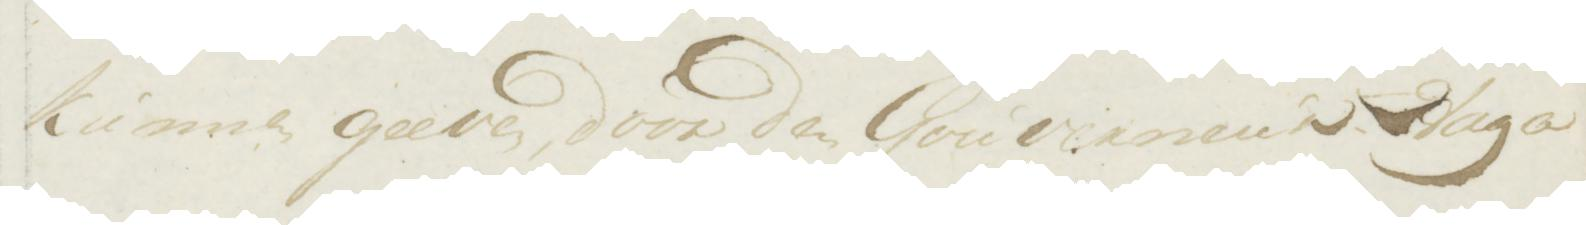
kunnen geeven, door den Gouverneur Haga
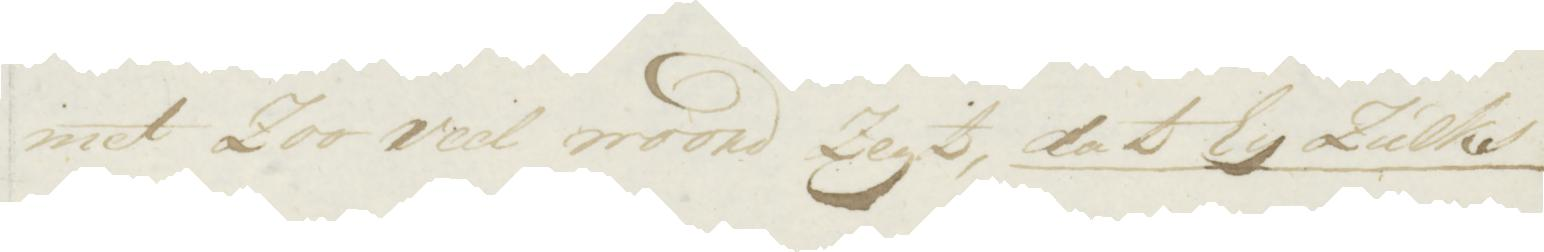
met zoo veel woord zeijt, dat hij zulks
